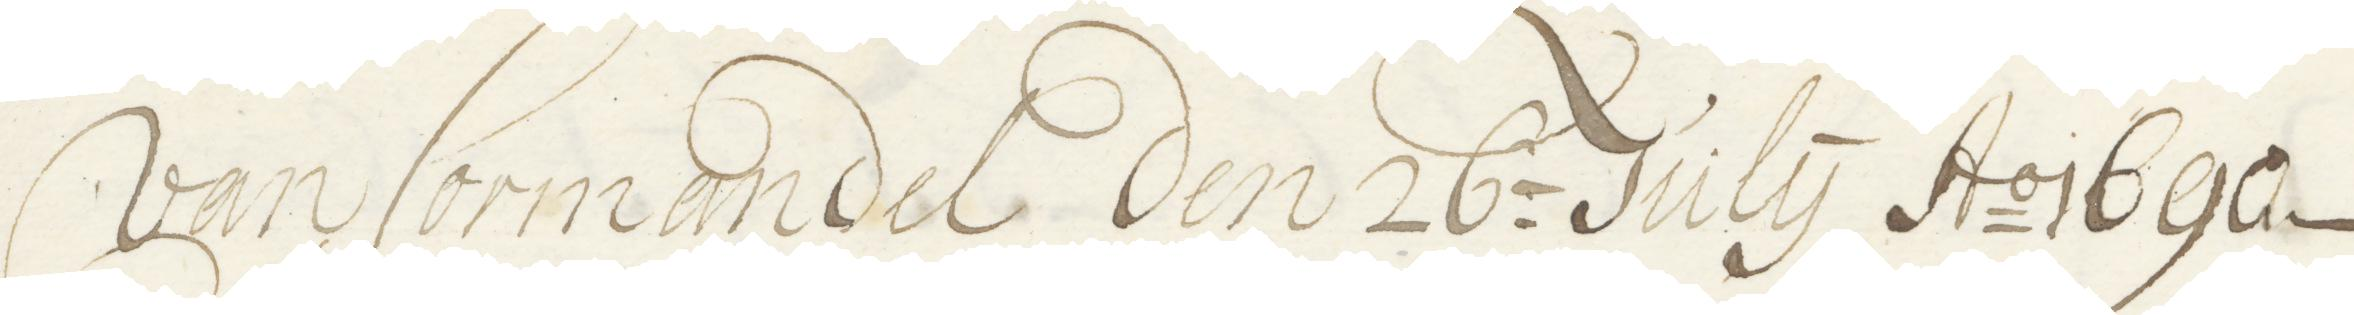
Van Cormandel den 26= Iulij A=o 1690.-
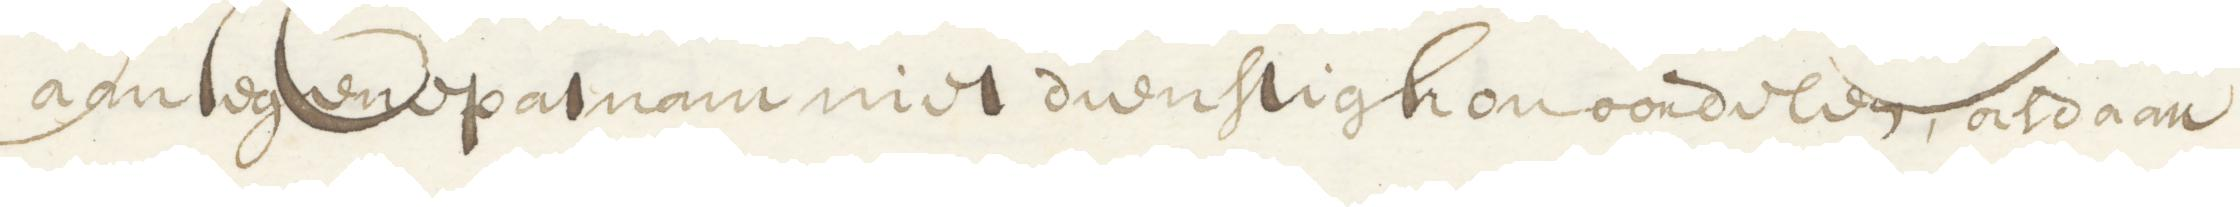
aan tegenepatnam niet dienstig kon oordelen, aldaar
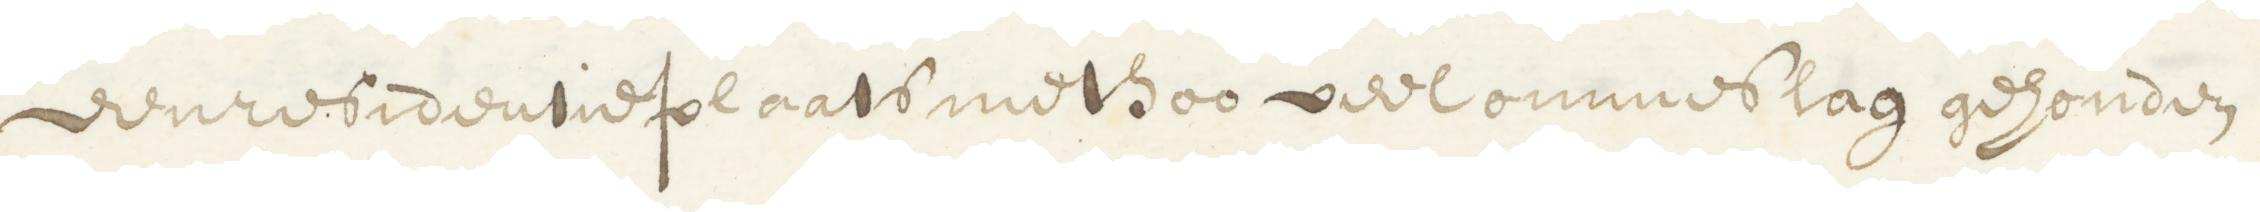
een residentieplaats met soo veel ommeslag gehouden
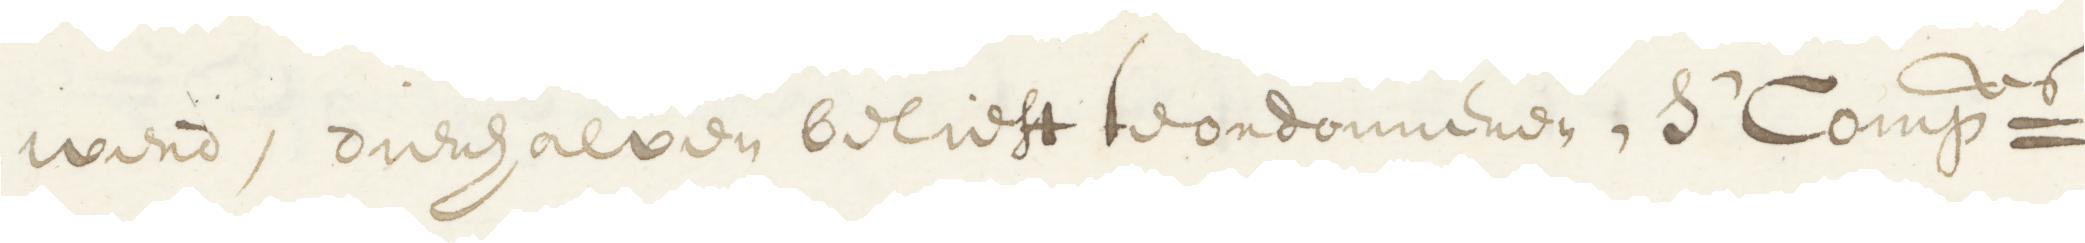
werd, dierhalven belieft te ordonneren, s' Comp=es
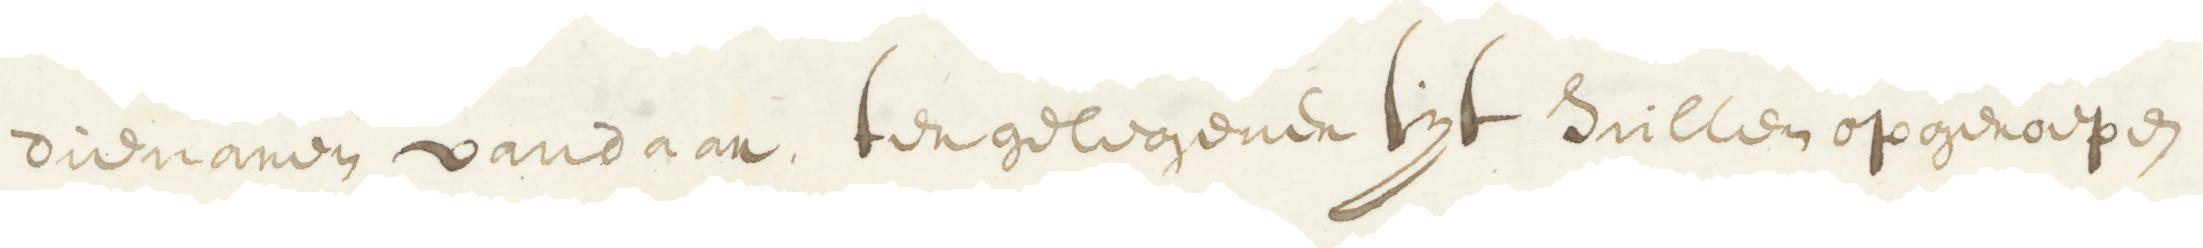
dienaren vandaar ter gelegener tijt sullen opgeroepen
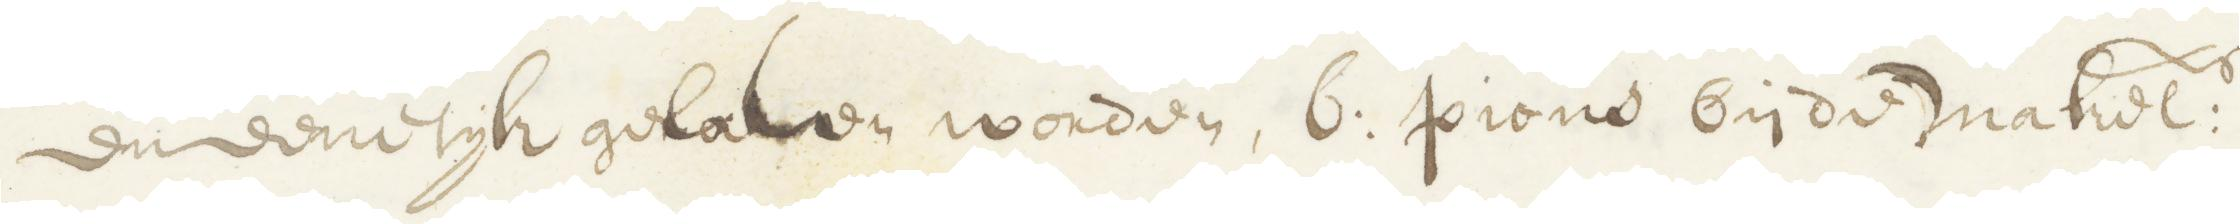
en eenelijk gelaten worden, 6: pions bij de makel:r
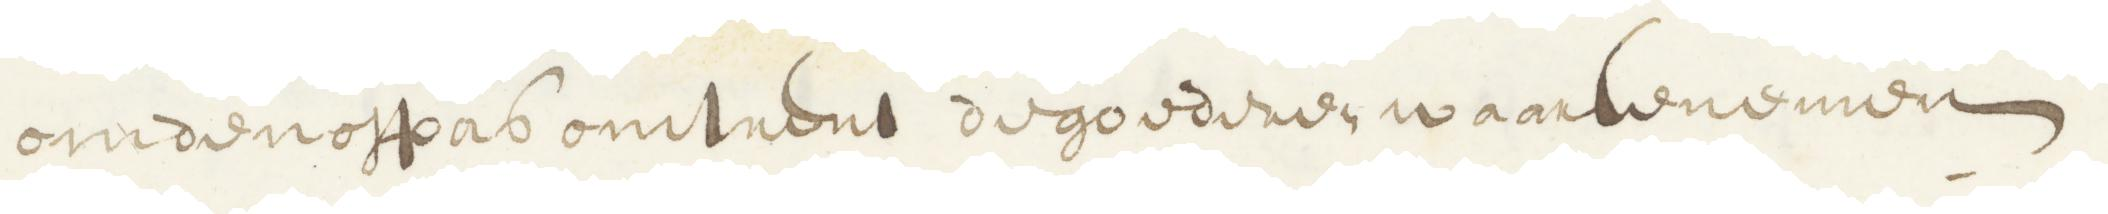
om den oppas omtrent de goederen waartenemen
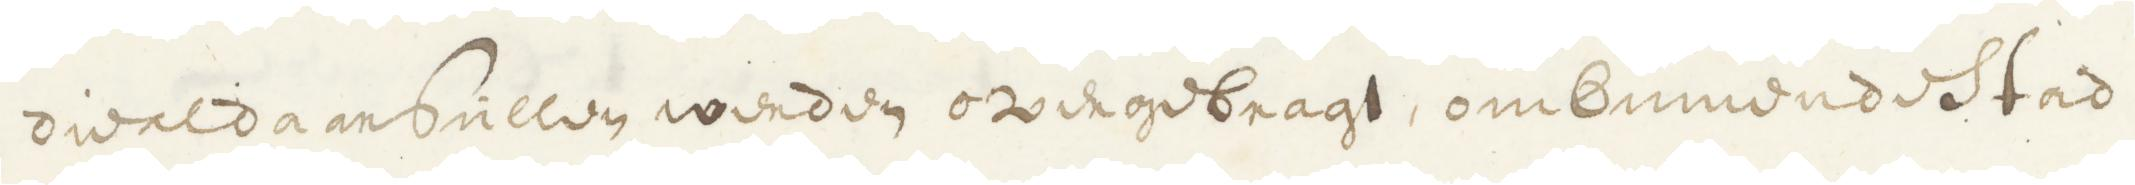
die al daar sullen werden overgebragt, om binnen de stad
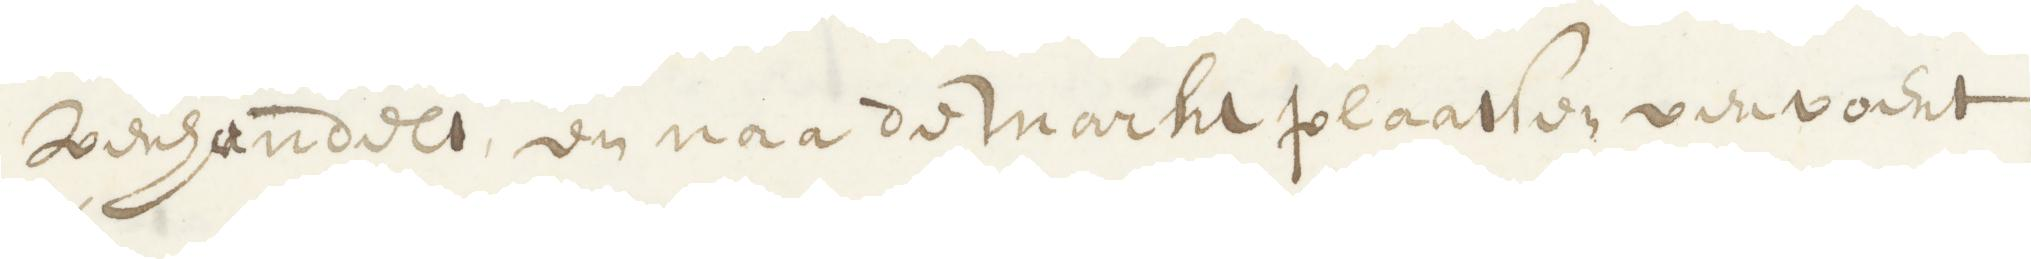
verhandelt, en naa de markt plaatsen vervoert
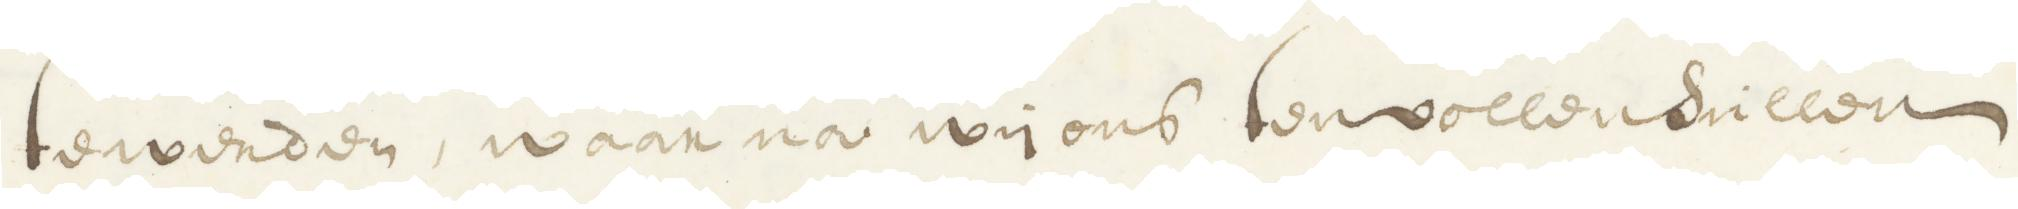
te werden, waar na wij ons ten vollen sullen
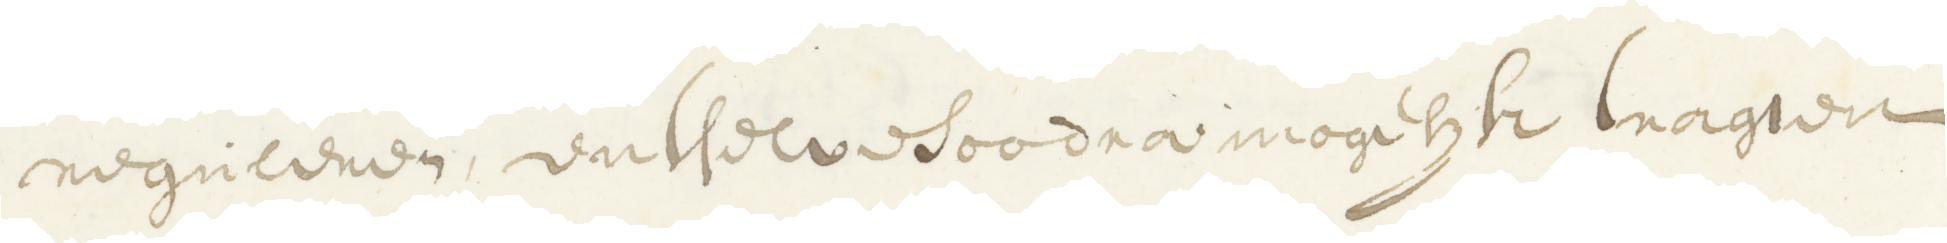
reguleren, en 't selve soo dra mogelijk tragten
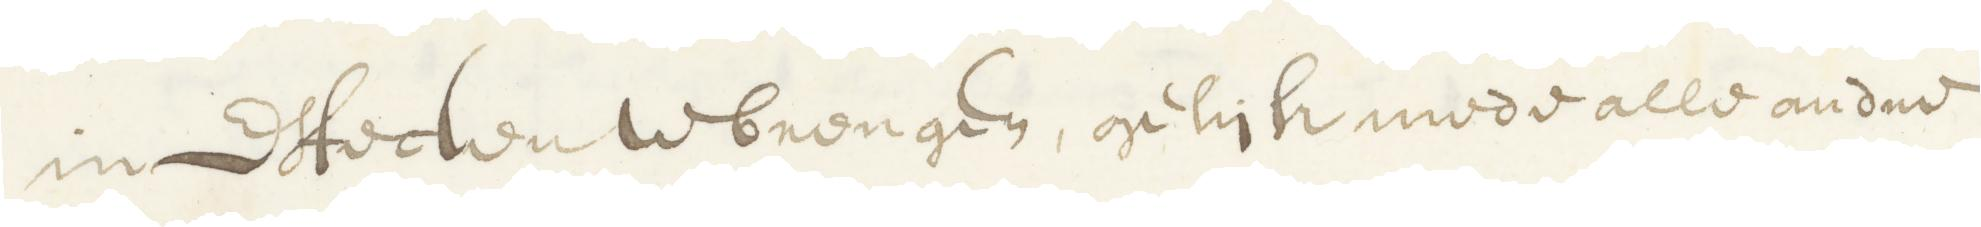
in Effecten te brengen, gelijk mede alle andre
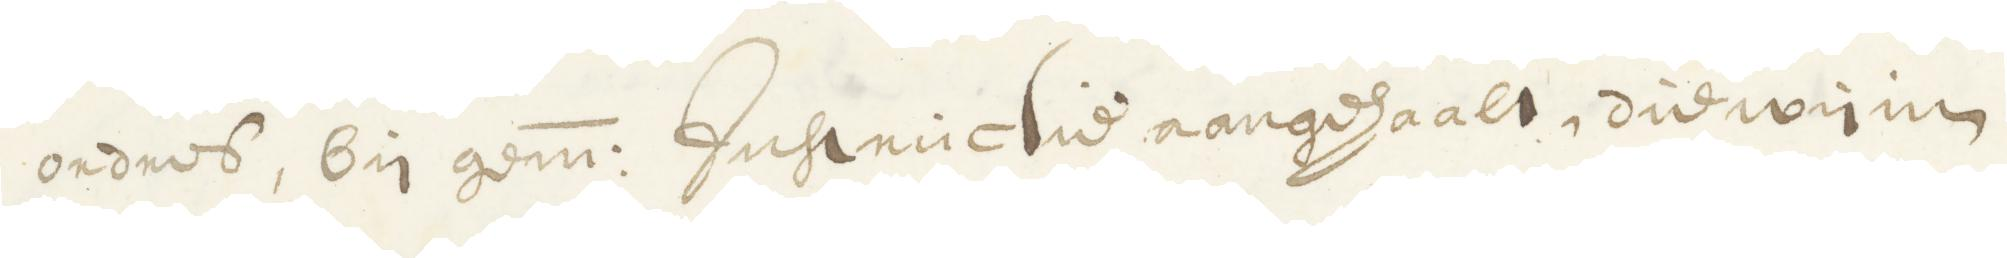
ordres, bij gem: Instructie aangehaalt, die wij in
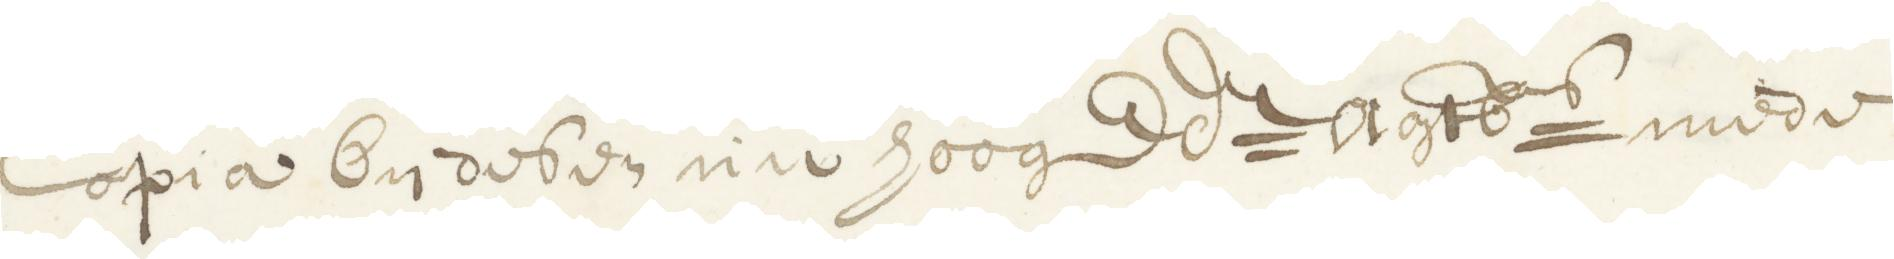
Copia by desen uw hoog Ed=t Agtb=s mede
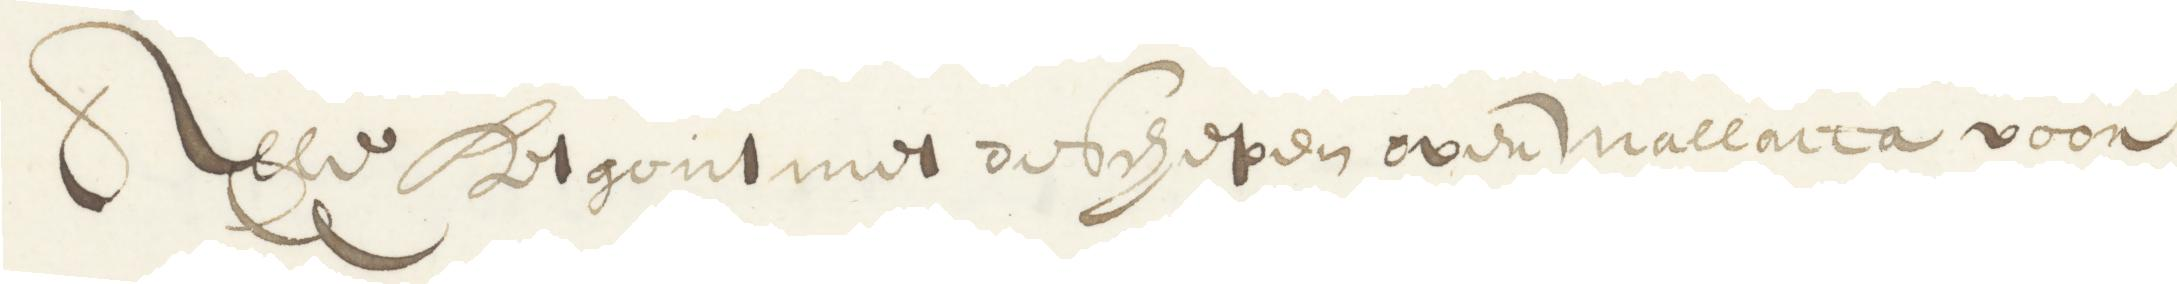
Alle Het gout met de schepen over mallacca voor
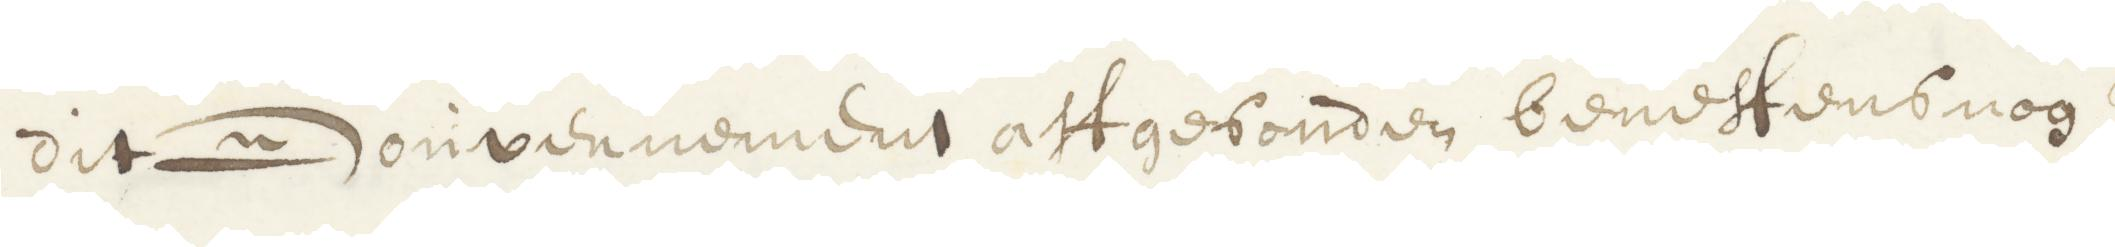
dit Gouvernement affgesonden beneffens nog
